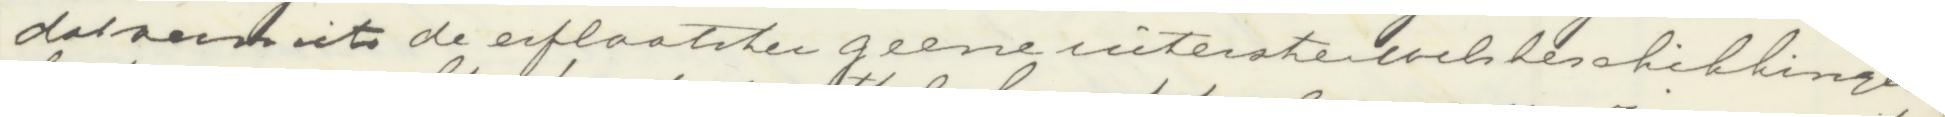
dat vermits de erflaatster geene uiterste wilsbeschikkingen
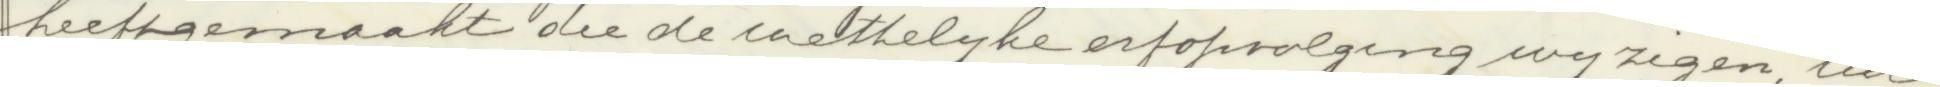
heeft gemaakt die de wettelyke erfopvolging wyzigen, uit
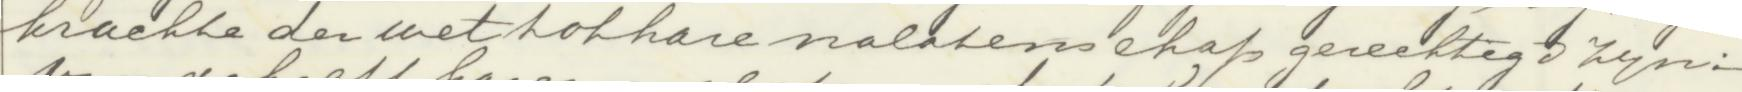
krachte der wet tot hare nalatenschap gerechtigd zyn:
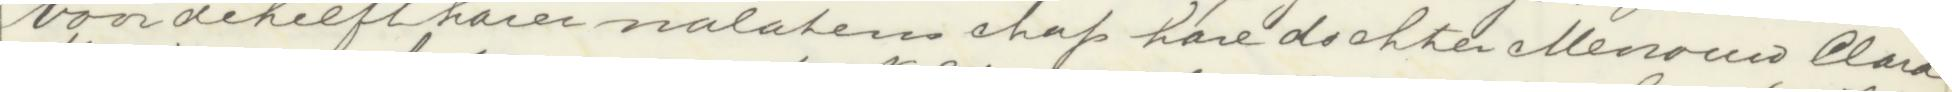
voor de helft harer nalatenschap hare dochter Mevrouw Clara
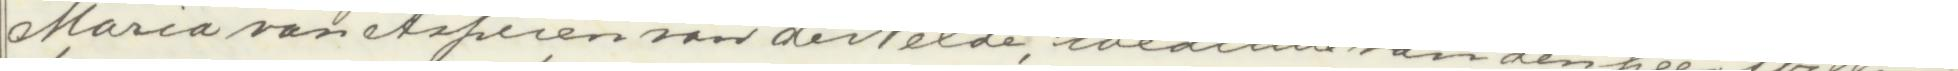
Maria van Asperen van der Velde, weduwe van den heer Willem
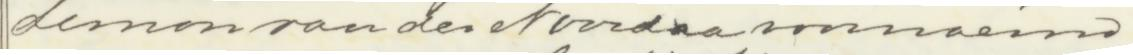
Simon van der Noordaa voornoemd
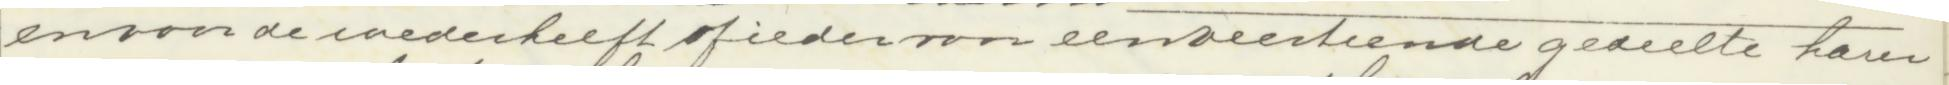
en voor de wederhelft of ieder voor een veertiende gedeelte harer
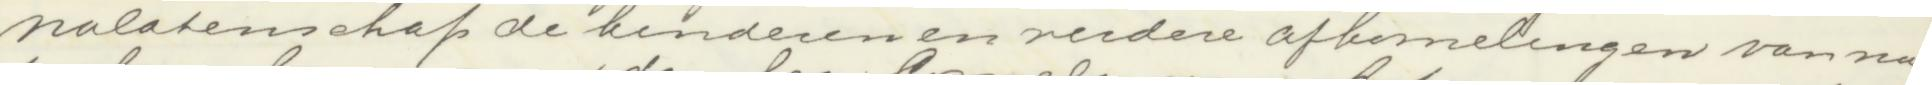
nalatenschap de kinderen en verdere afkomelingen van nu
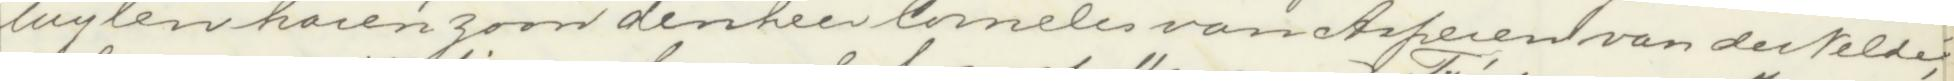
wylen haren zoon den heer Cornelis van Asperen van der Velde,
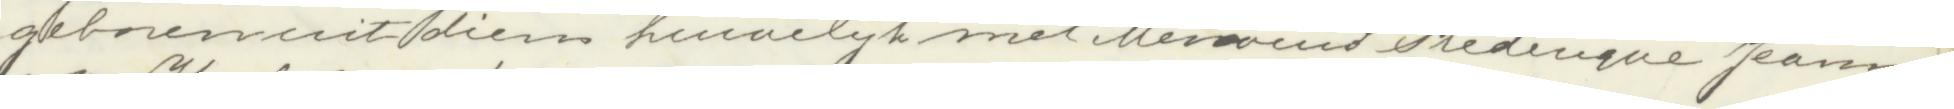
geboren uit diens huwelyk met Mevrouw Fréderique Jeanne
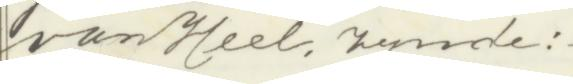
van Heel, zynde:
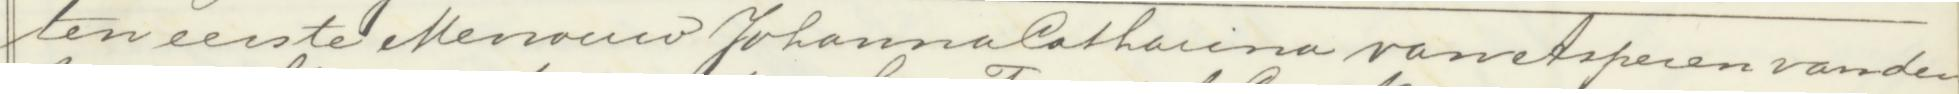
ten eerste Mevrouw Johanna Catharina van Asperen van der
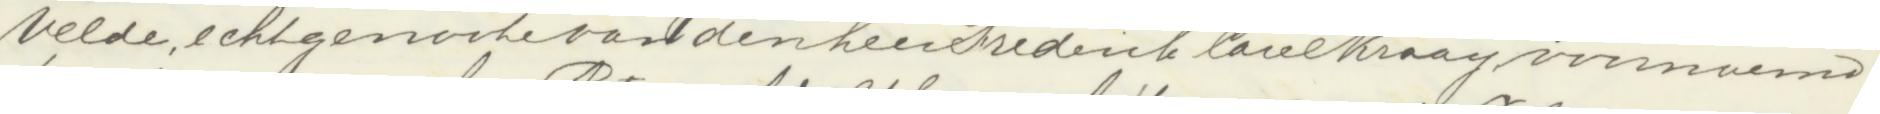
Velde, echtgenoote van den heer Frederik Carel Kraay voornoemd
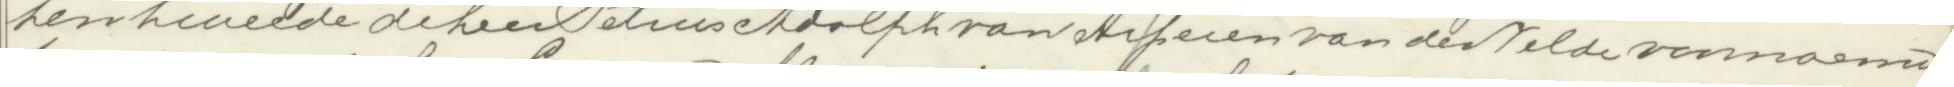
ten tweede de heer Petrus Adolph van Asperen van der Velde voornoemd
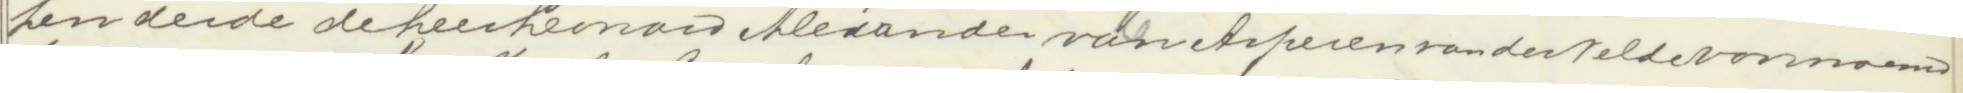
ten derde de heer Leonard Alexander van Asperen van der Velde voornoemd
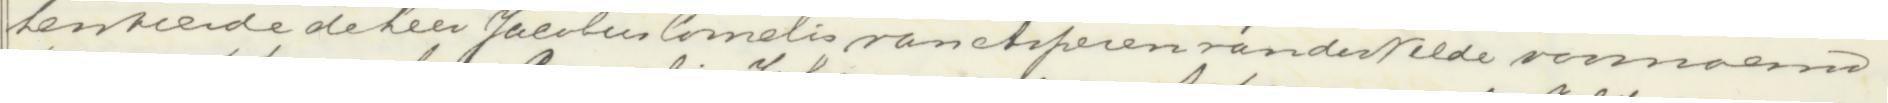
ten vierde de heer Jacobus Cornelis van Asperen van der Velde voornoemd
